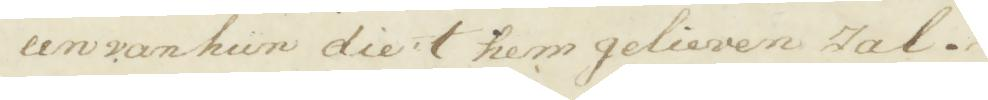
een van hun die ’t hem gelieven zal.-
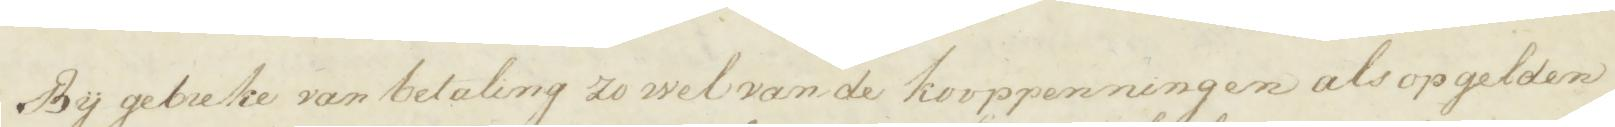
Bij gebreke van betaling zo wel van de kooppenningen als opgelden
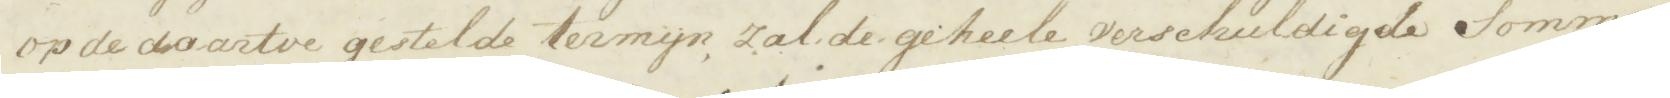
op de daartoe gestelde termijn, zal de geheele verschuldigde somma
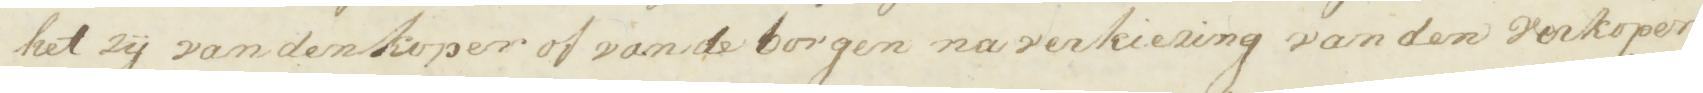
het zij van den koper of van de borgen na verkiezing van den verkoper
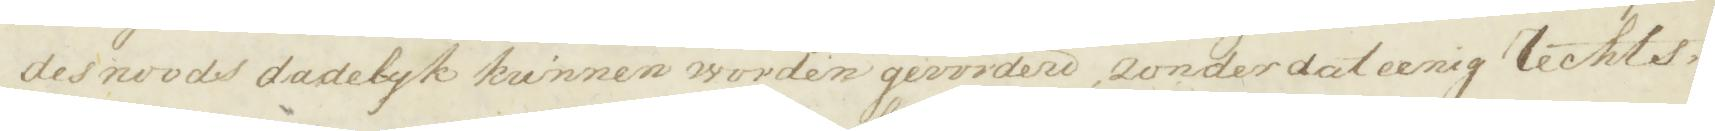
des noods dadelyk kunnen worden gevorderd, zonder dat eenig Rechts,
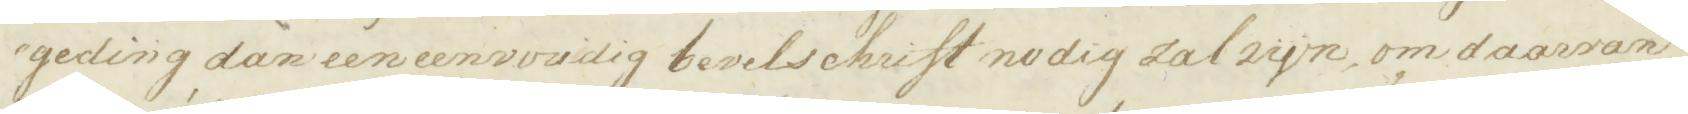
„geding dan een eenvoudig bevelschrift nodig zal zijn, om daarvan
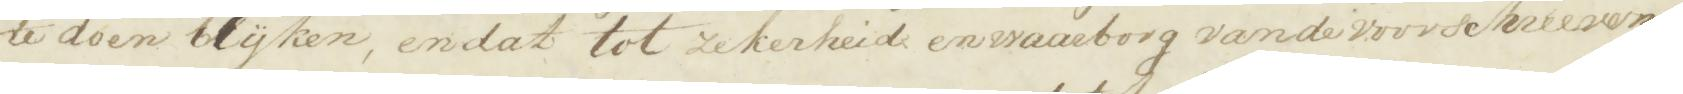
te doen blijken, en dat tot zekerheid en waarborg van de voorschreeven
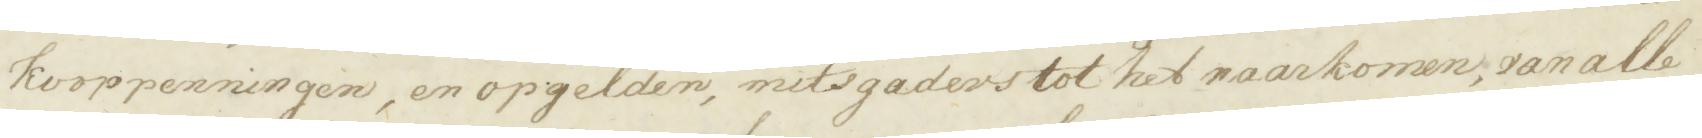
kooppenningen, en opgelden, mitsgaders tot het naarkomen, van alle
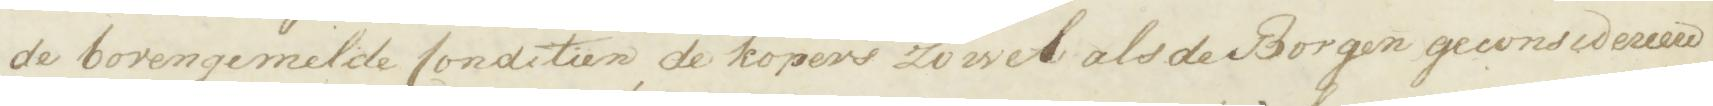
de bovengemelde Conditien, de kopers zo wel als de Borgen geconsidereerd
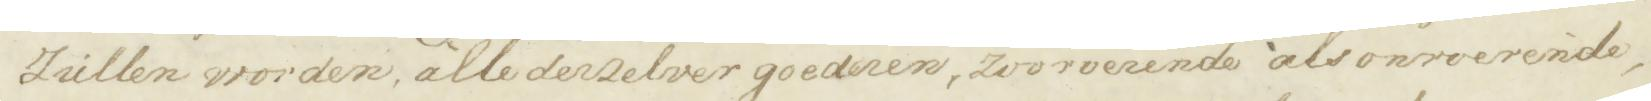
zullen worden, alle derzelver goederen, zoo roerende als onroerende
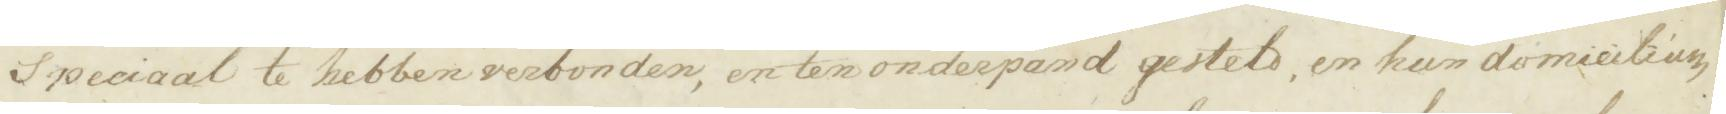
speciaal te hebben verbonden, en ten onderpand gesteld, en hun domicilium
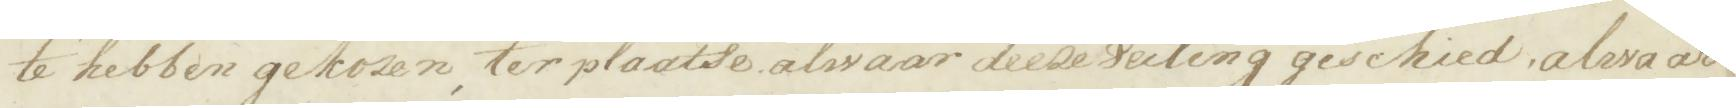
te hebben gekozen, ter plaatse alwaar deeze veiling geschied, alwaar
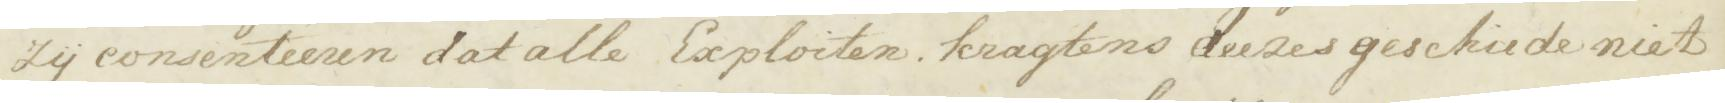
zij consenteeren dat alle Exploiten, kragtens deezes geschiede niet
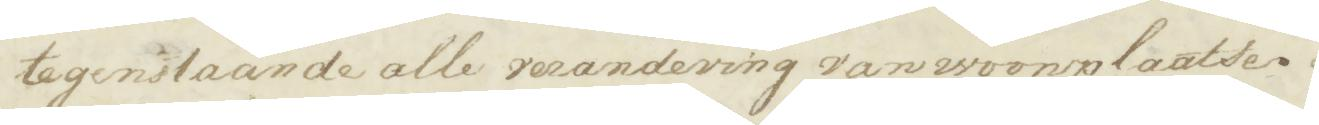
tegenstaande alle verandering van woonplaatse.
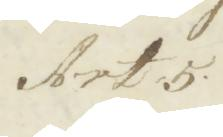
Art 5:
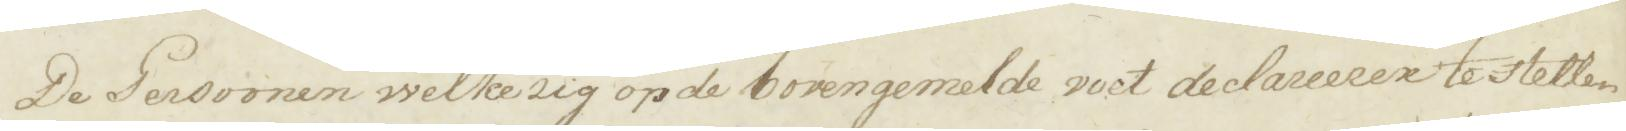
De Persoonen welke zig op de bovengemelde voet declareeren te stellen
